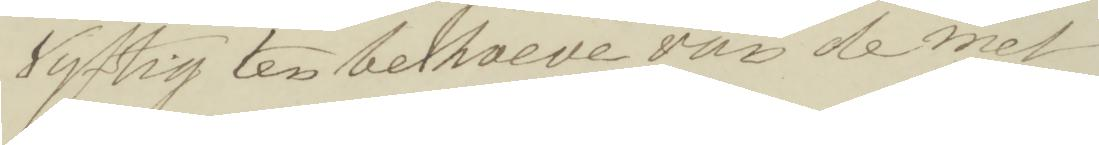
Vijftig ten behoeve van de met
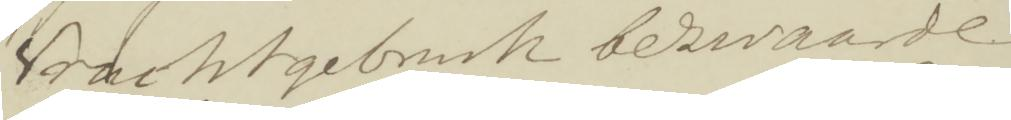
Vruchtgebruik bezwaarde
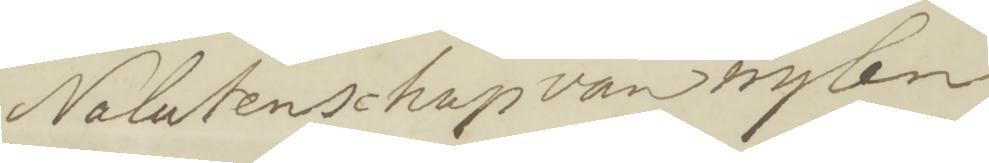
Nalatenschap van wylen
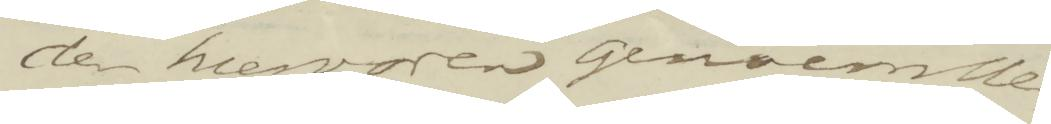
den hiervoren genoemden
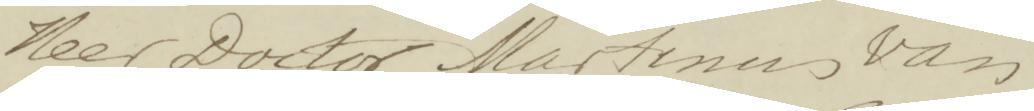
Heer Doctor Martinus van
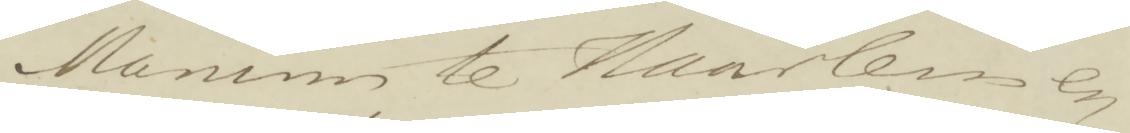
Marum te Haarlem en
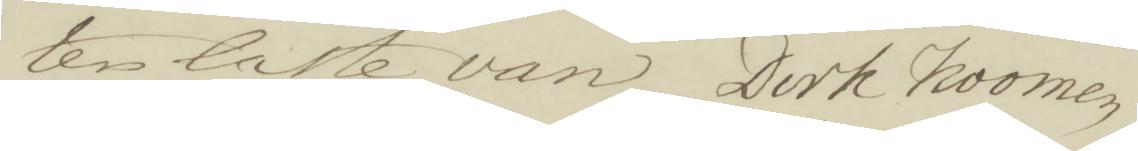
ten laste van Dirk Koomen
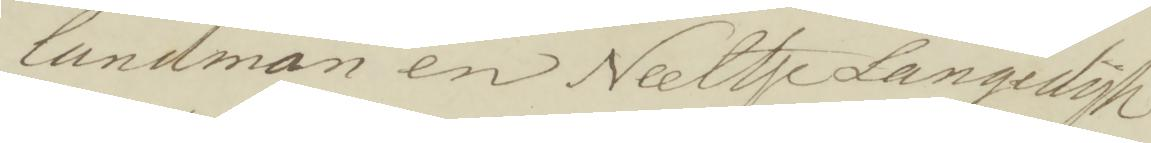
landman en Neeltje Langedijk
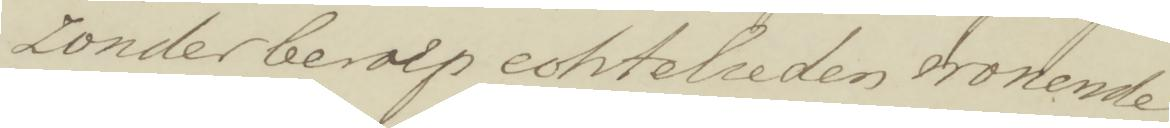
zonder beroep echtelieden wonende
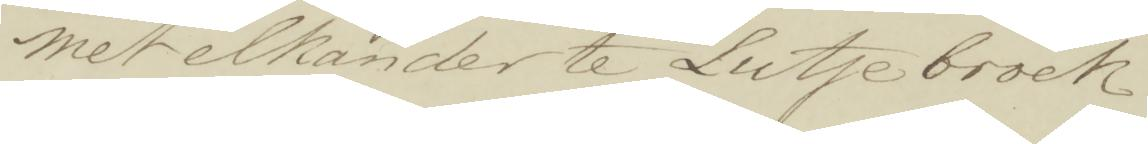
met elkander te Lutjebroek
